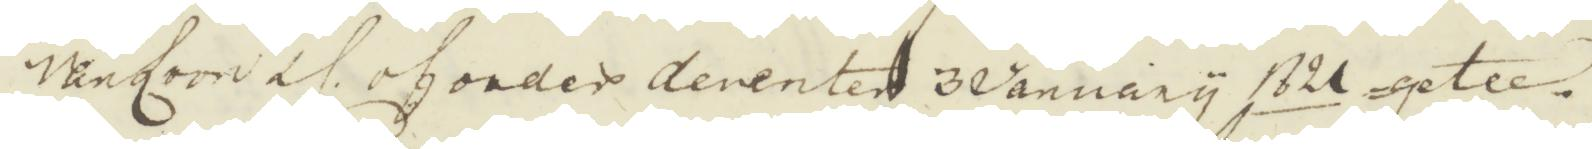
van Loon &C. of onder deventer 3 Januarij 1821 = getee.
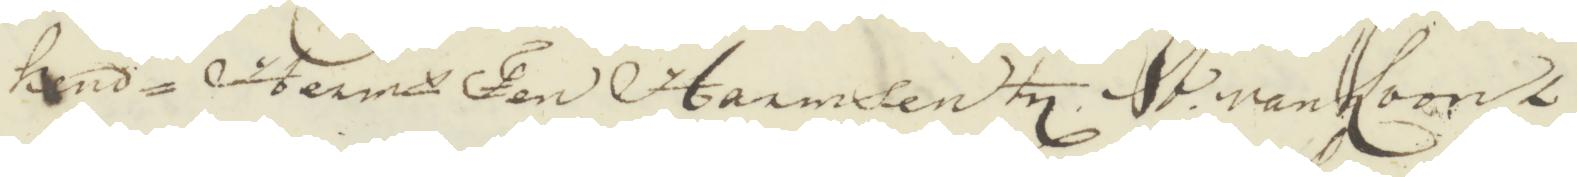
kend = Herm-s Ten Harmsen tn A. van Loon &
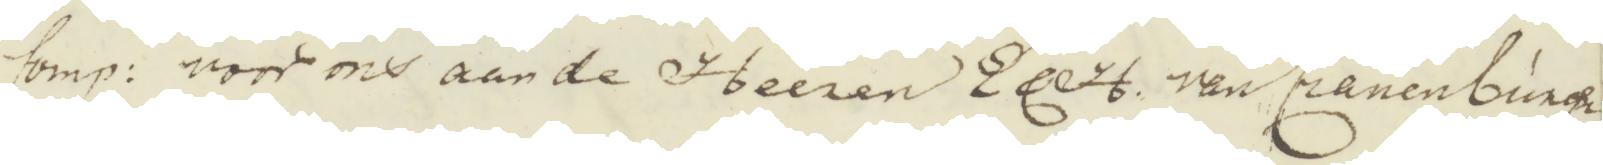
Comp: voor ons aan de Heeren E & H. van Cranenburg
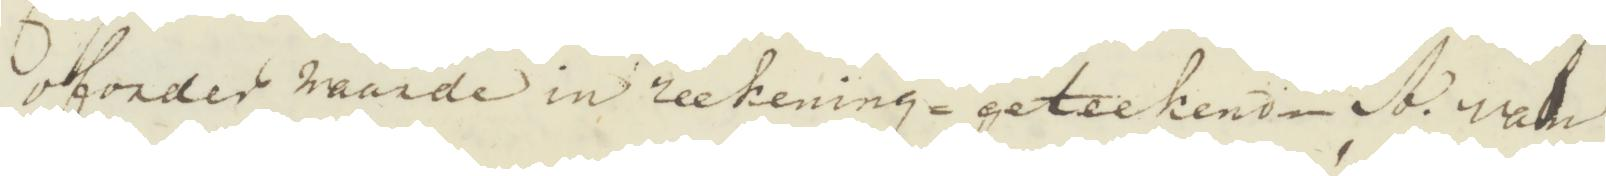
of order waarde in reekening = geteekend = A. van
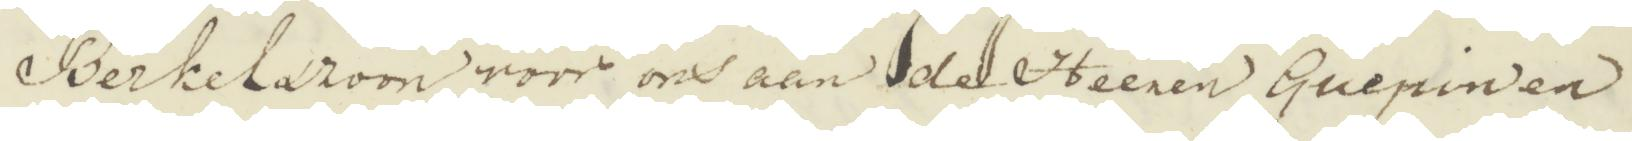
Berkel & zoon voor ons aan de Heeren Guepin en
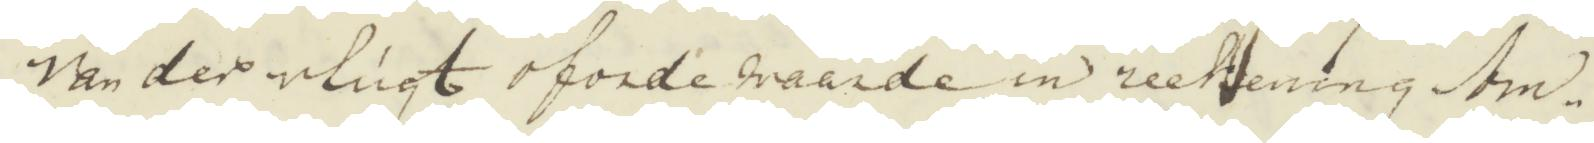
van der vlugt of orde waarde in reekening A„
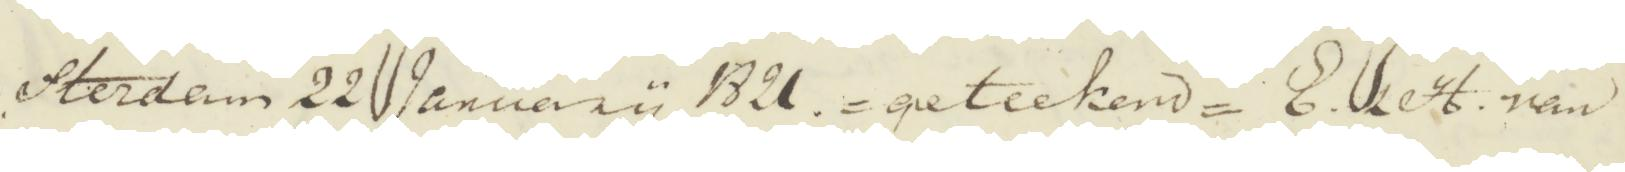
sterdam 22 Januarij 1821. = geteekend = E. & H. van
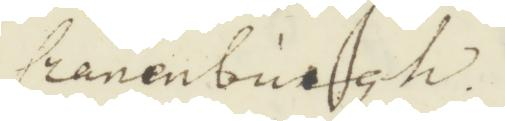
Cranenburgh.
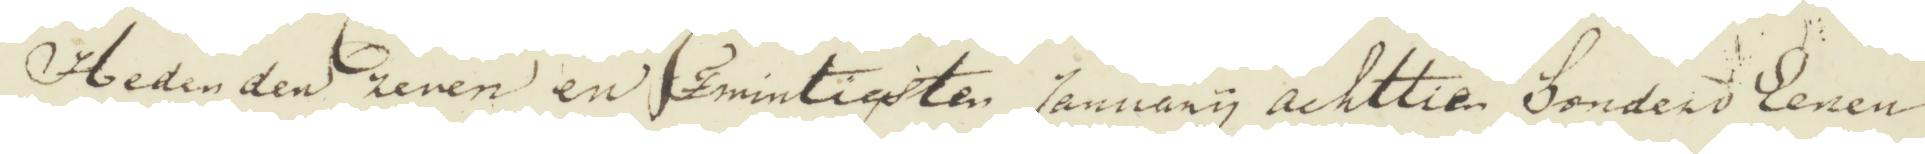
Heden den zeven en Twintigsten Januarij achttien Honderd Eenen
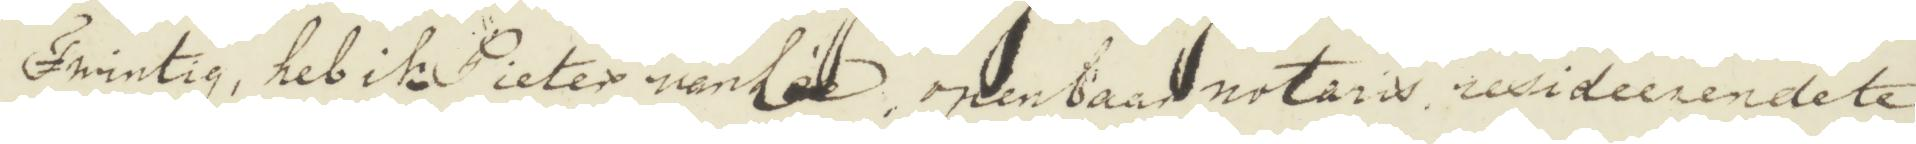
Twintig, heb ik Pieter van Leè, openbaar notaris, resideerende te
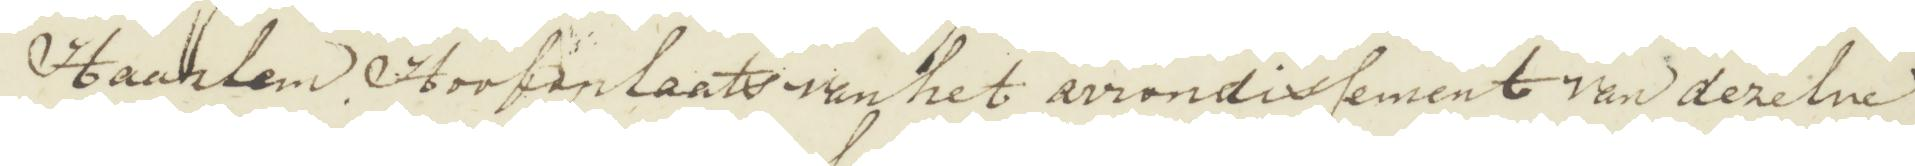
Haarlem Hoofdplaats van het arrondissement van dezelve
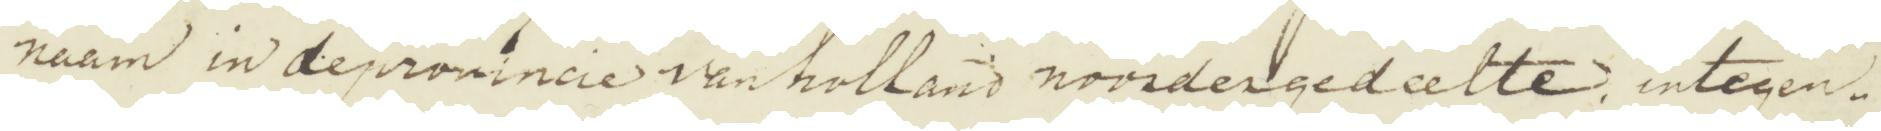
naam in de provincie van holland noordergedeelte, integen„
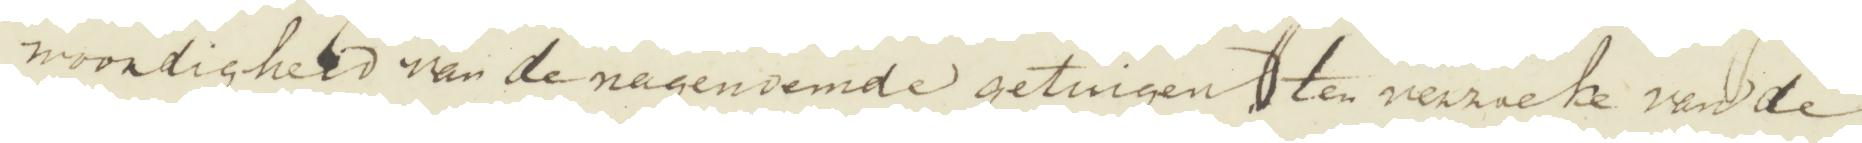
woordigheid van de nagenoemde getuigen, ten verzoeke van de
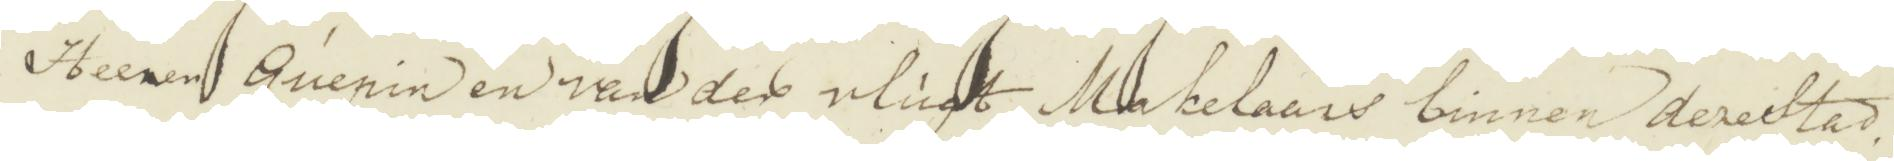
Heeren Guepin en van der vlugt, Makerlaars binnen deze Stad,
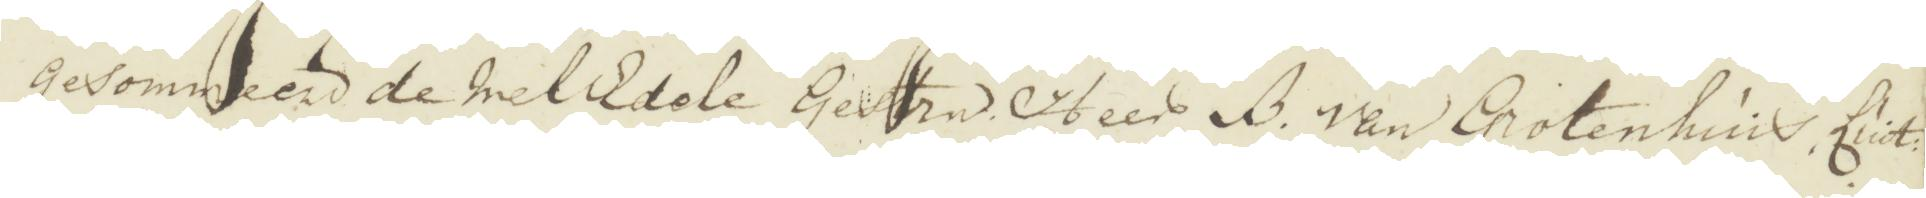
gesommeerd de wel Edele Gestrn. Heer B. van Grotenhuis, Luit:
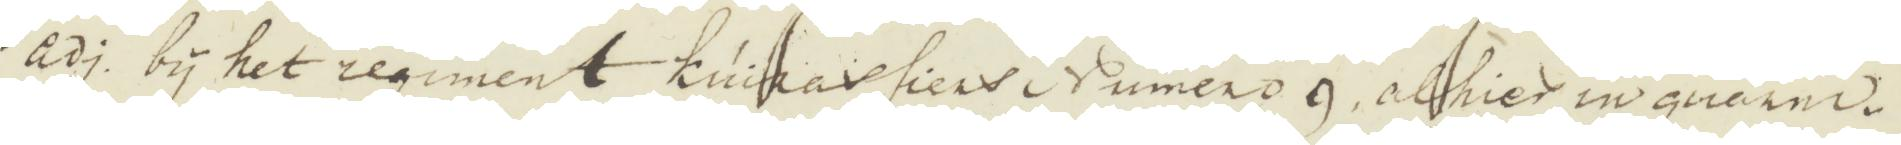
adj. bij het regiment kuirassiers Nummer 9, alhier in guarni„
